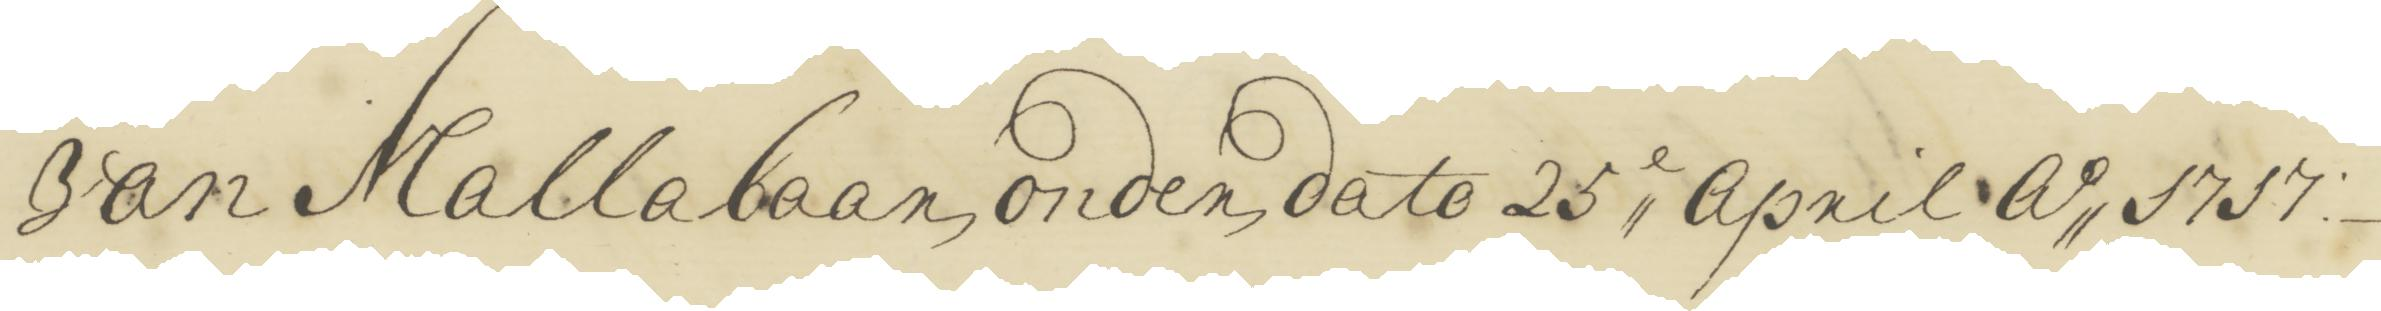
Van Mallabaar onder dato 25„e April A„o 1717:—
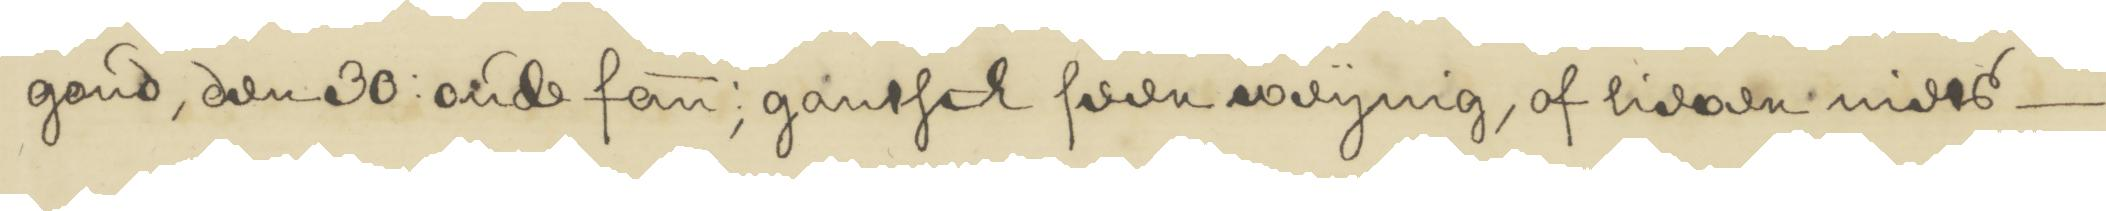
goud, den 30: oude fan:, gantsch seer weijnig, of liever niets —
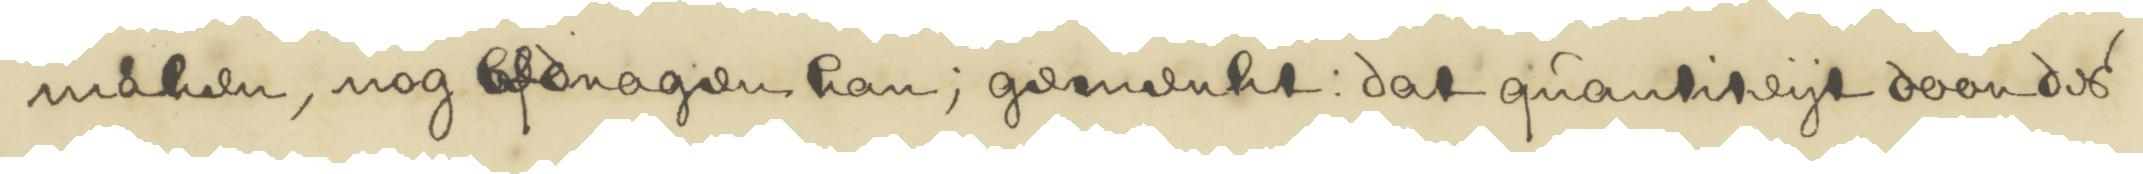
maken, nog bedragen kan; gemerkt: dat quantiteijt door des
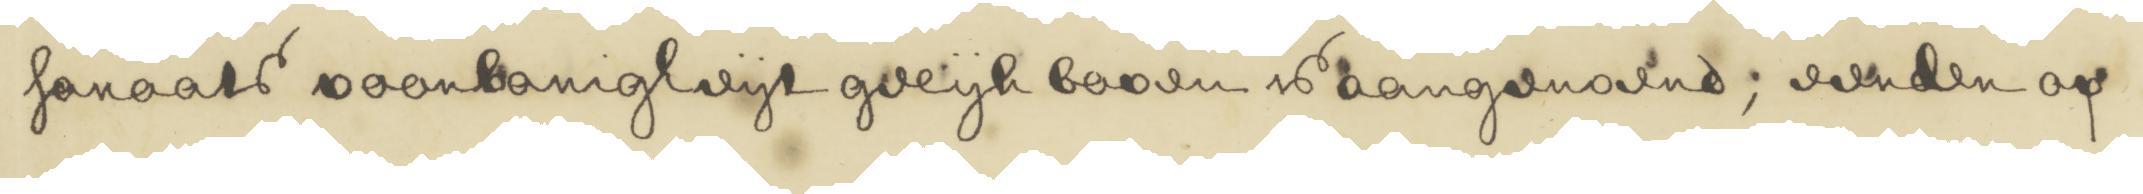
saraats voorbarigheijt gelijk boven is aangevoerd; eerder op
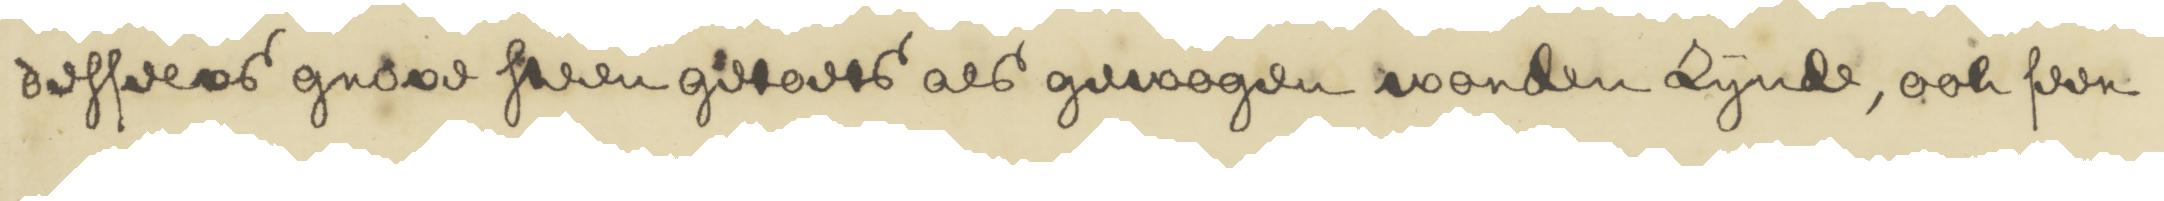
desselvs grove steen getoets als gewogen worden zijnde, ook seer
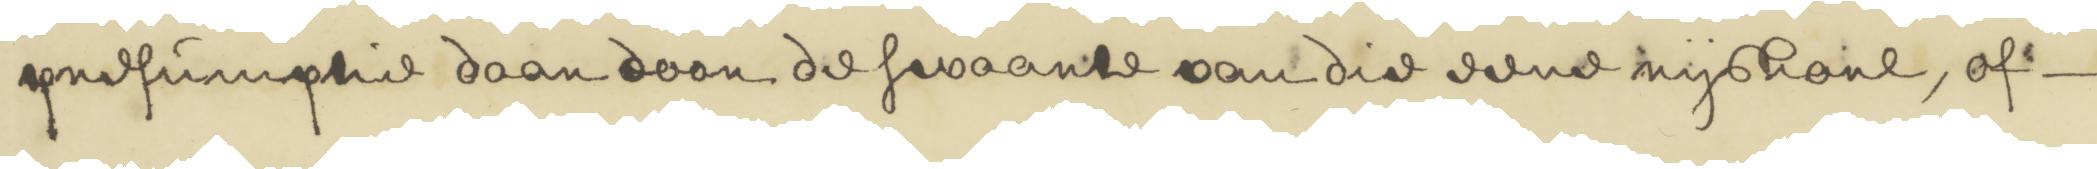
presumptie daar door de swaarte van die eene rijskorl, of —
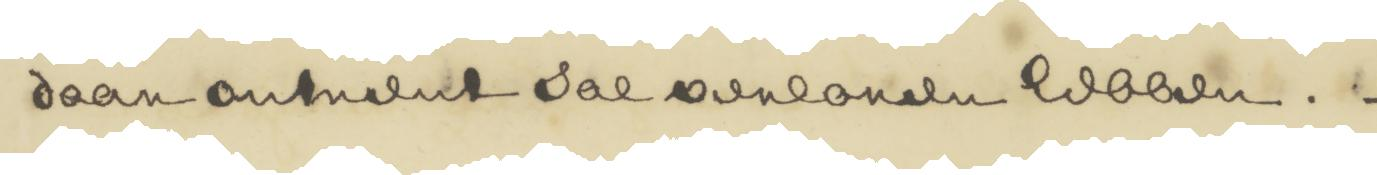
daar ontrent sal verloren hebben.
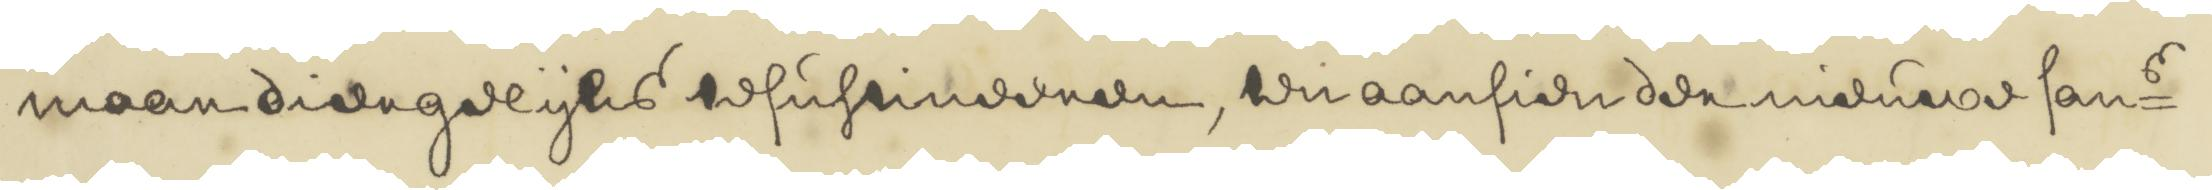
maar diergelijks te sustineeren, ten aansien der nieuwe san=s
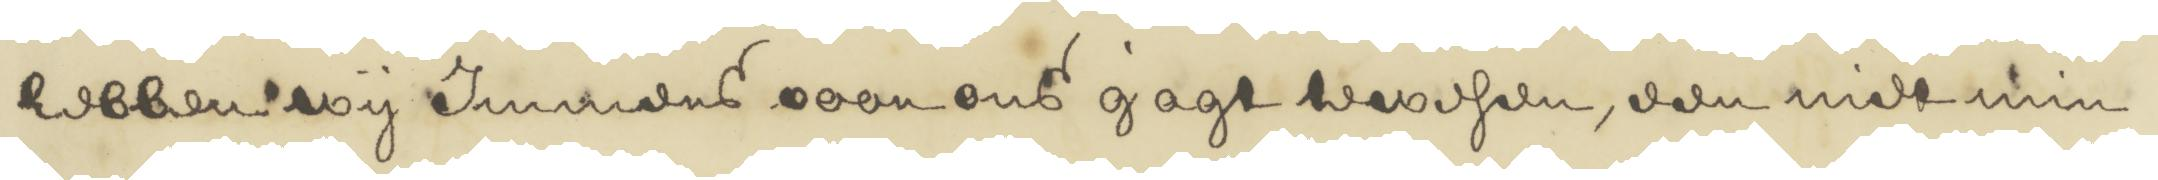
hebben wij Immers voor ons g'agt tewesen, een niet min
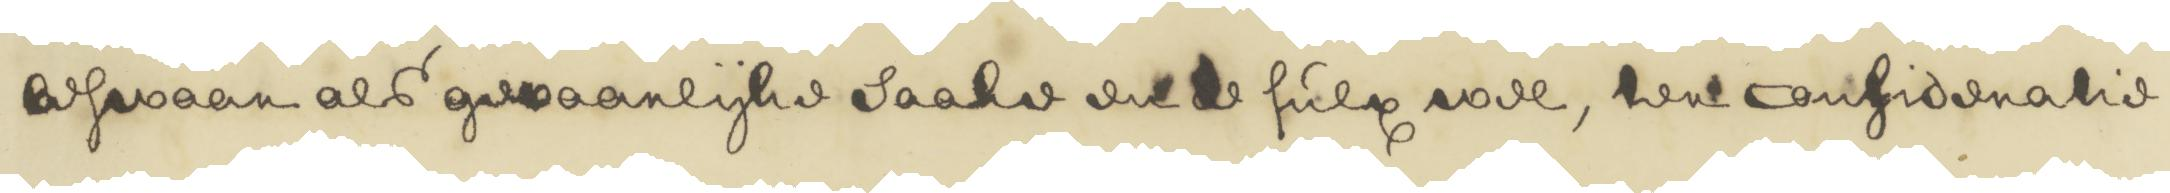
beswaar als gevaarlijke saake en de sulx wel, ter consideratie
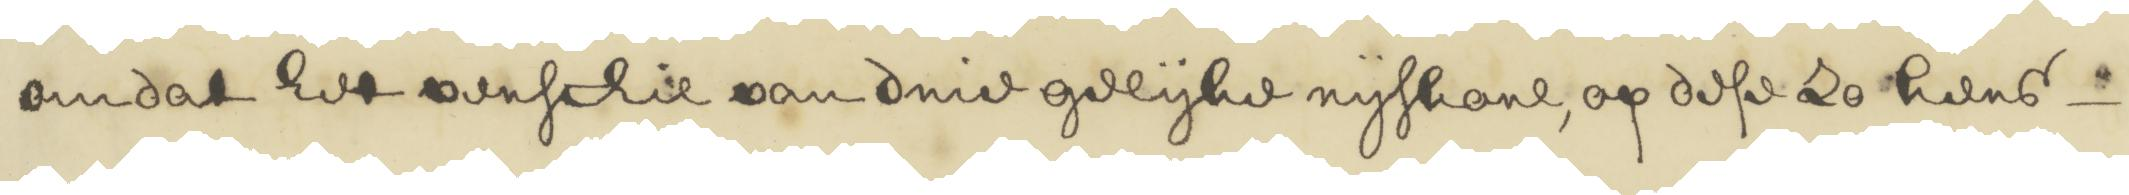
om dat het verschil van drie gelijke rijskorl, op dese zo kers —
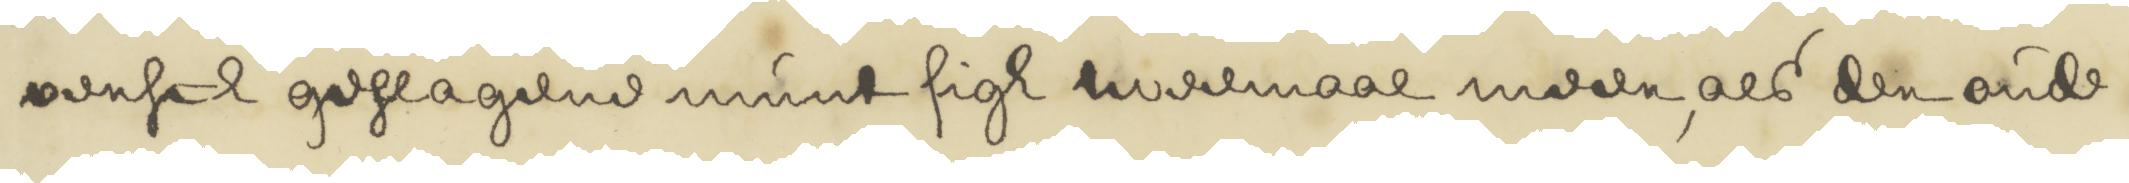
versch geslagene munt sigh tweemaal meer, als der oude
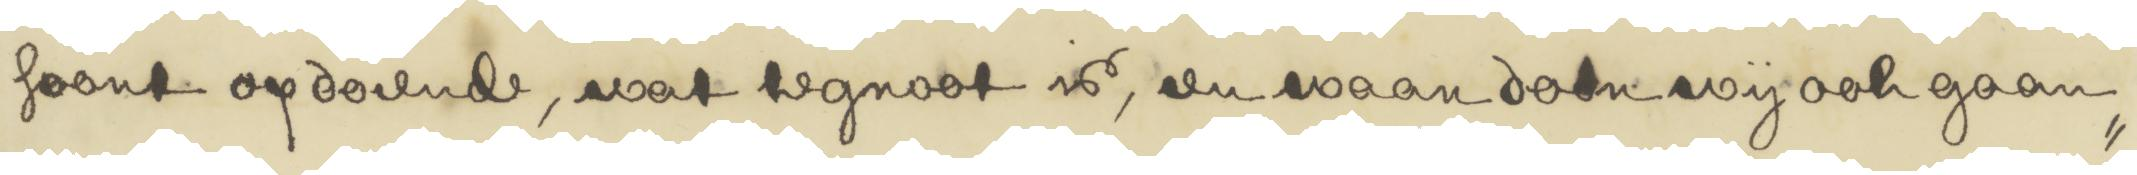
soort op doende, wat tegroot is, en waar door wij ook gaan„
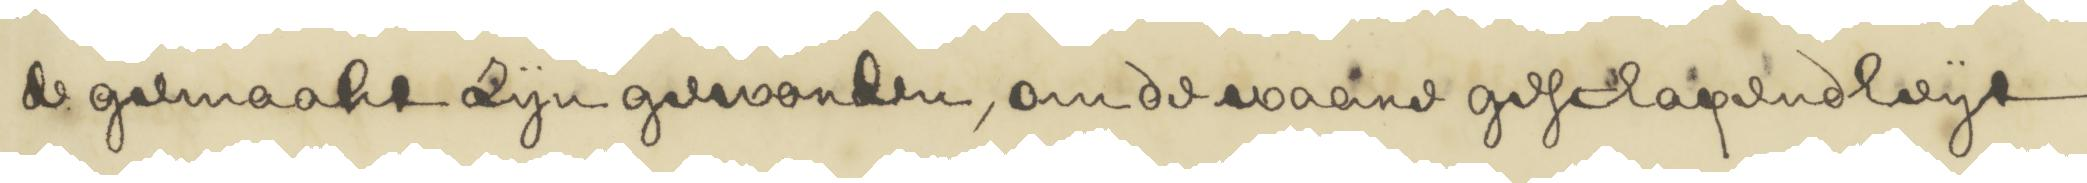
de gemaakt zijn geworden, om de waare geschapendheijt
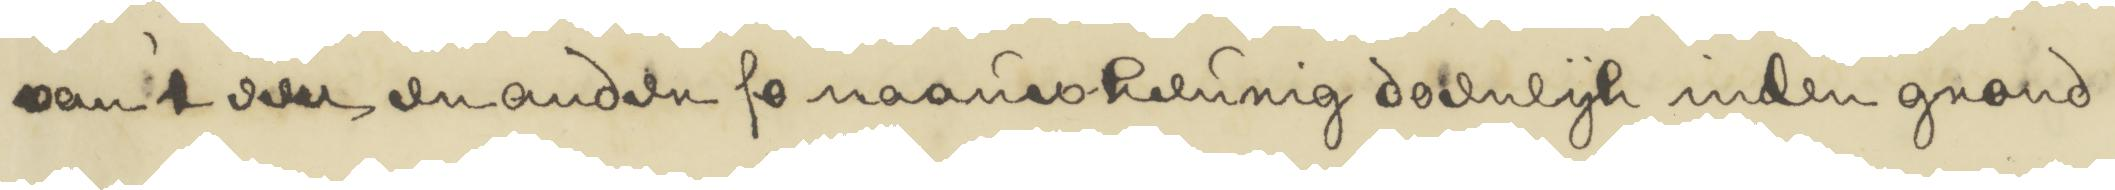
van ’t een en ander so naauwkeurig doenlijk inden grond
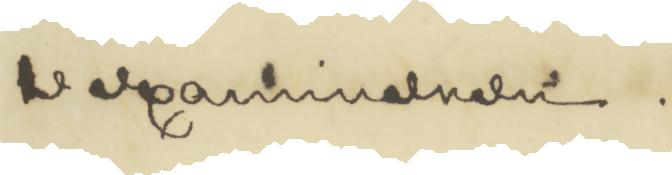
te examineren
